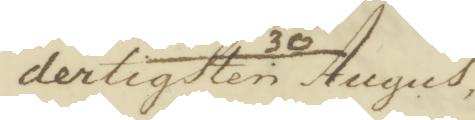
dertigsten Augus
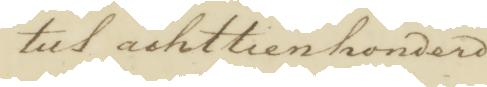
tus achttien honderd
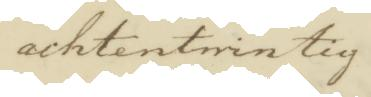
achtentwintig
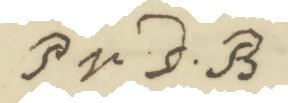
P v. d. B
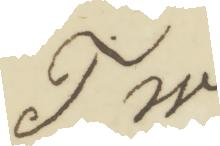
Tw
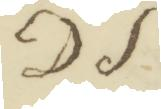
D I
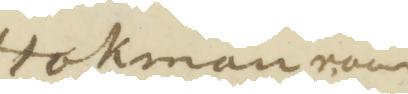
THokman voor
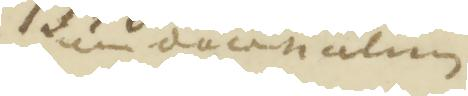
een doorhaling
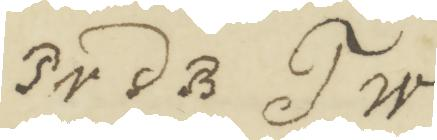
Pv dB Tw
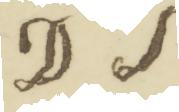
DS
